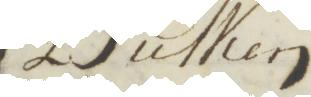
2 Piekken
